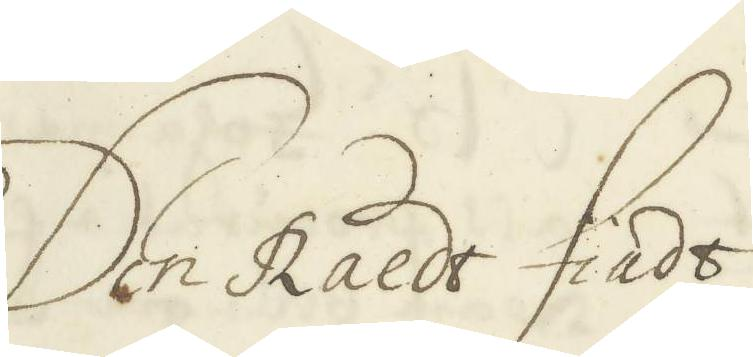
Den Raed fiadt
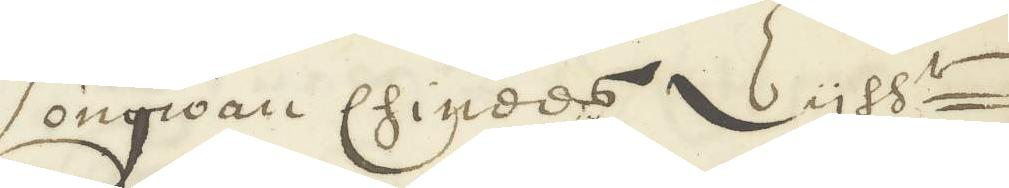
Tongwan Chinees Eijss=r
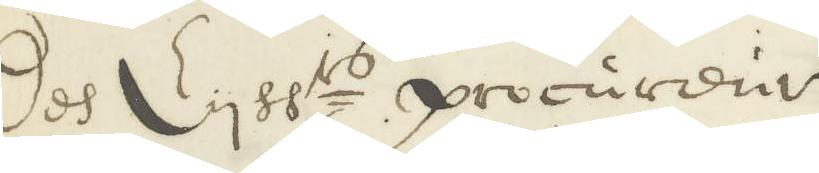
Des Eijss=rs procureur
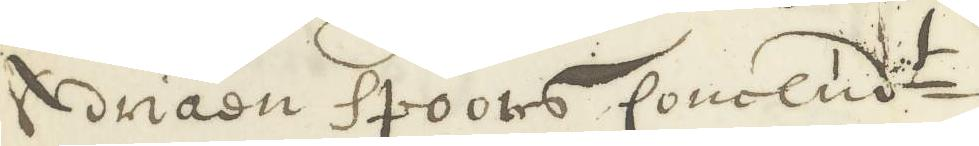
Adriaen spoors Conclud=t
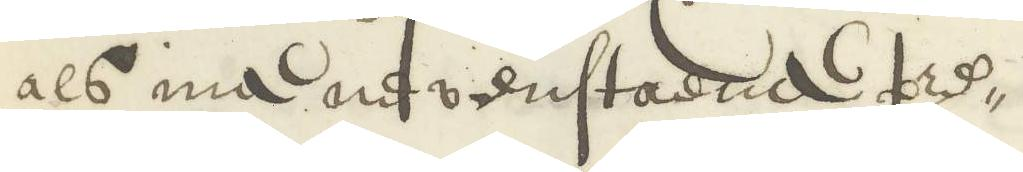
als inde onverstaende pre„
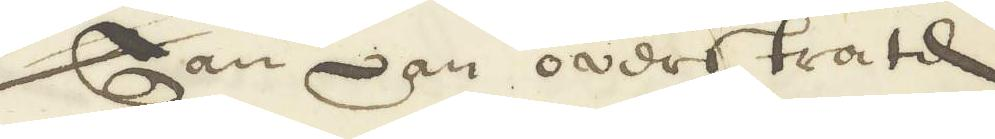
Jan van overstraten
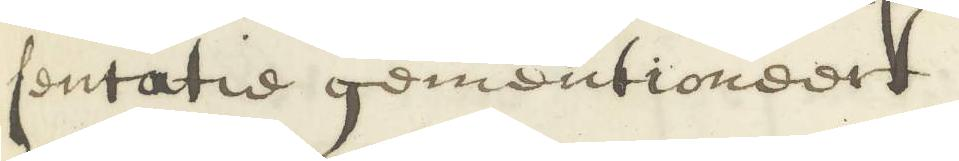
sentatie gementioneert
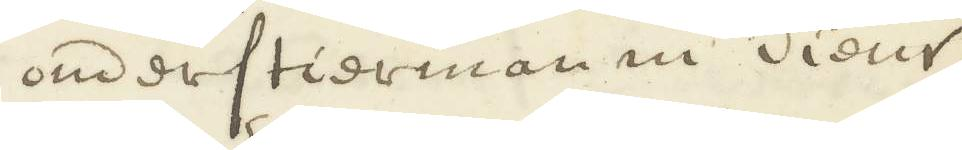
onderstierman in dienst
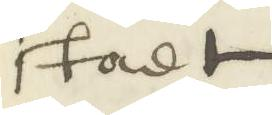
staet
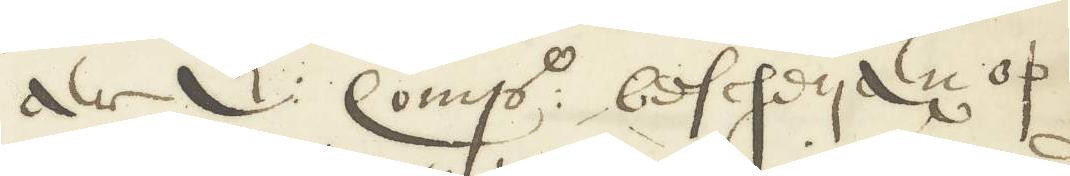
der E: Comp:e bescheyden op
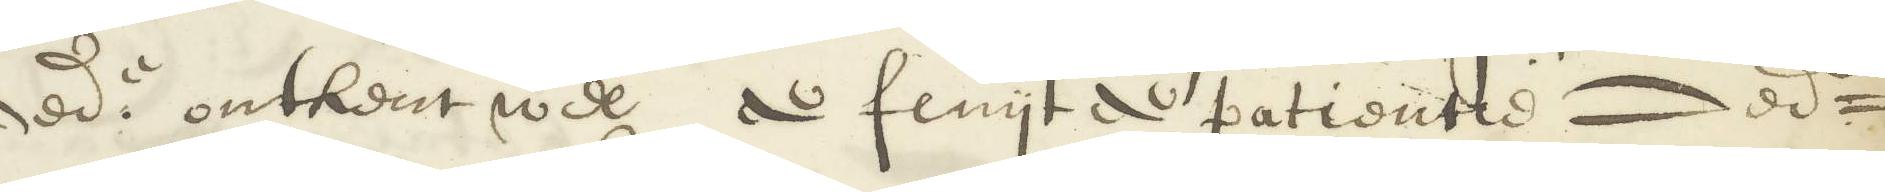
Ged:e ontkent wel de fluijt de patientie Ged=e
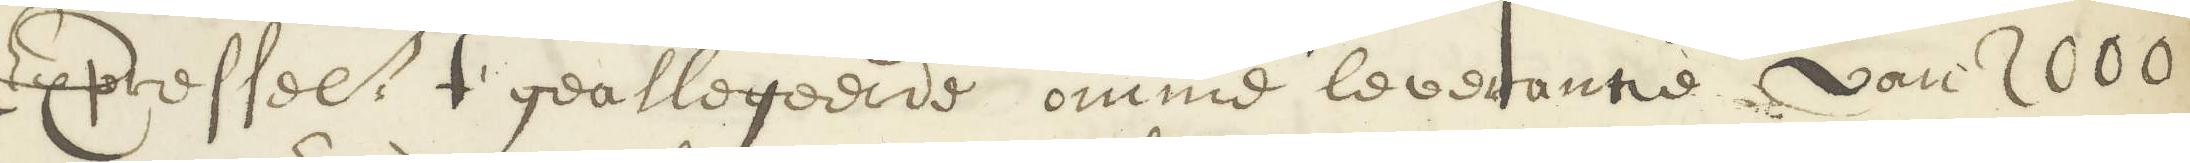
Expresselijk t' geallegeerde omme leverantie van 2000
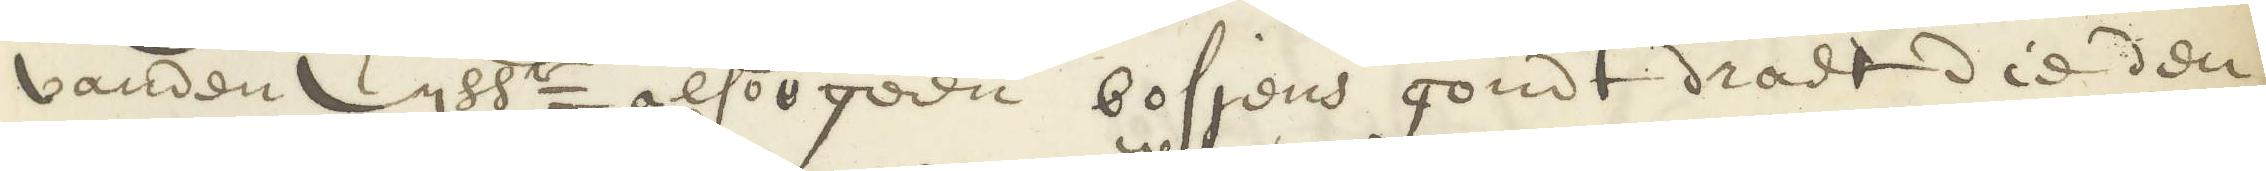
van den Eyss=r alsoo geen bosjens goudt draet die den
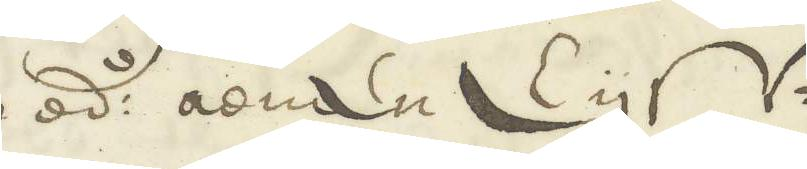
Ged:e aenden Eijss=r
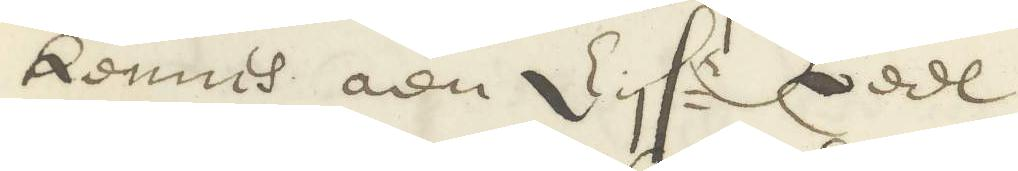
kennis aen Eijs=r veel
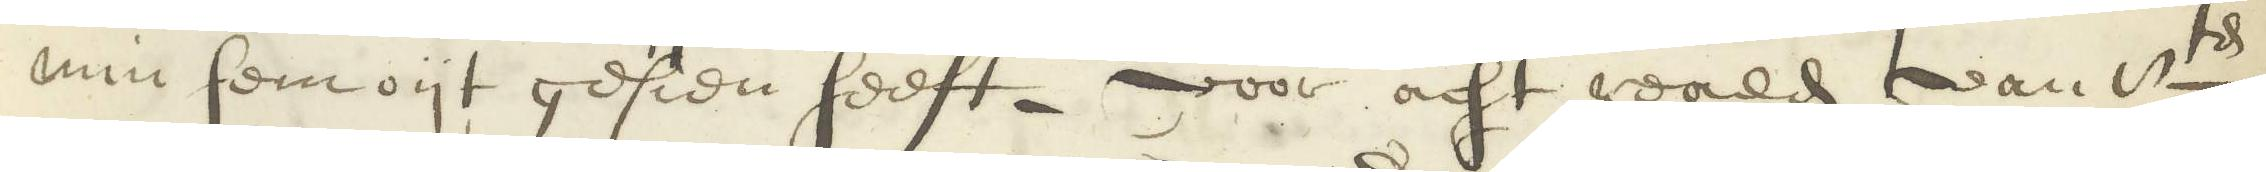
min fem oijt gesien heeft – voor acht realen van 8=ten
